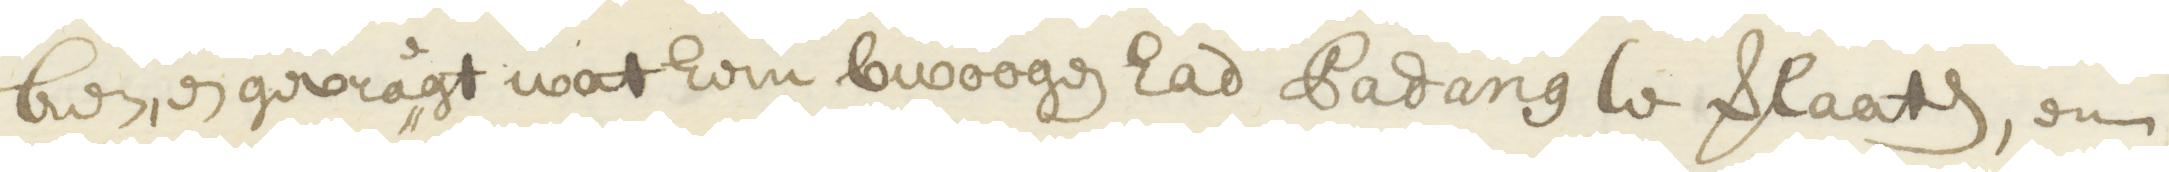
ken, en gevra„egt wat hem bwoogen had Padang te verlaaten, en
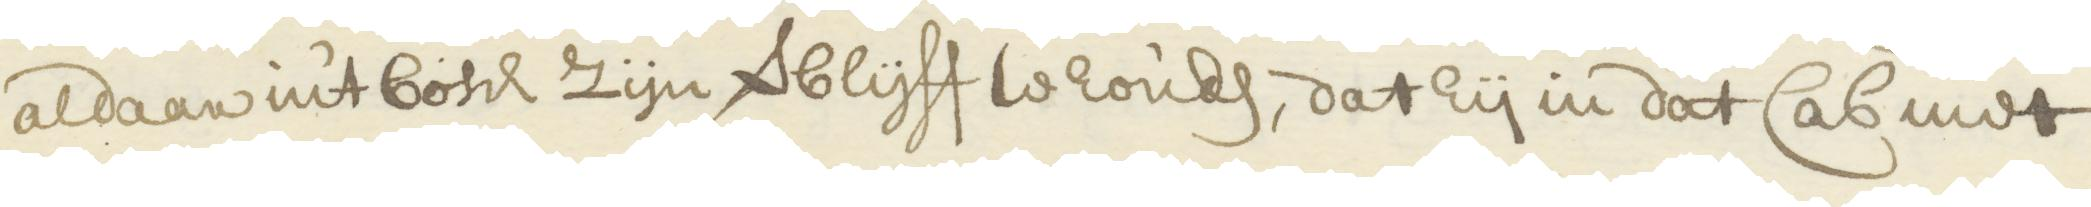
aldaar in 't bosch zijn verblijff te houden, dat hij in dat Cas met
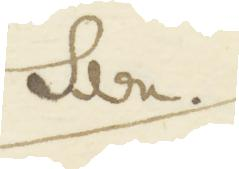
seer.
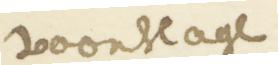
voorslage
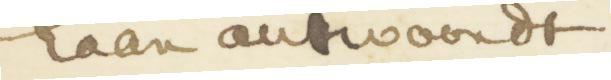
haar antwoordt
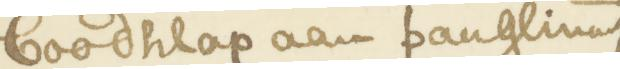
boodschap aan panglima
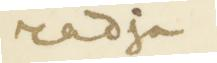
radja
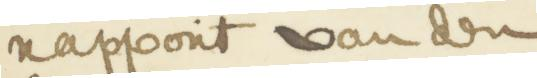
rapport van den
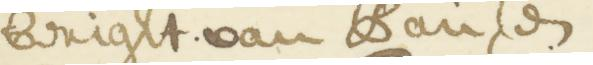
beright van Pau en
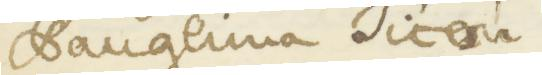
Panglima Ticou
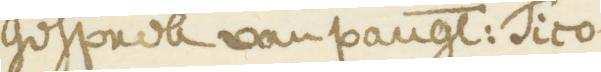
gesprek van pangl: Tico
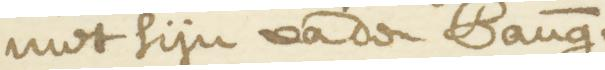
met sijn vader Pang
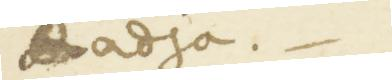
Radja. —
